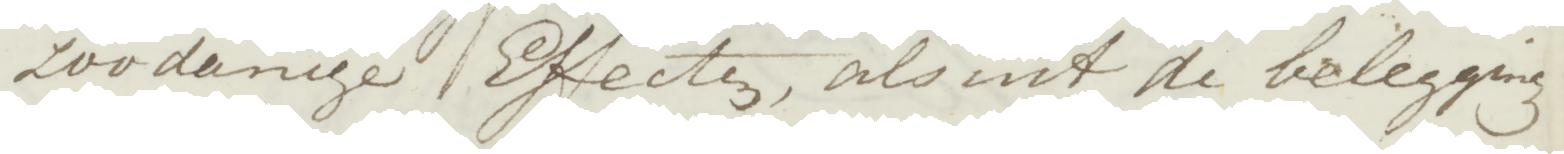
zoodanige Effecten, als uit de belegging
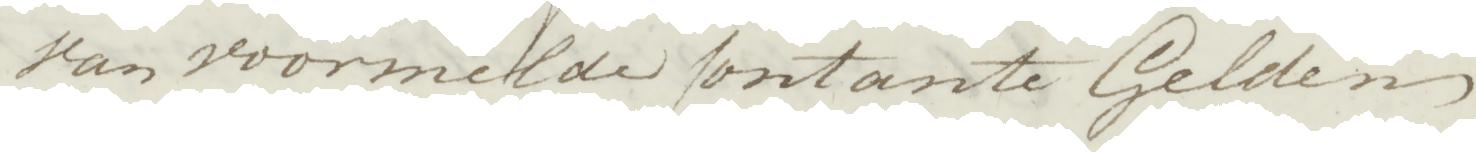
van voormelde Contante Gelden
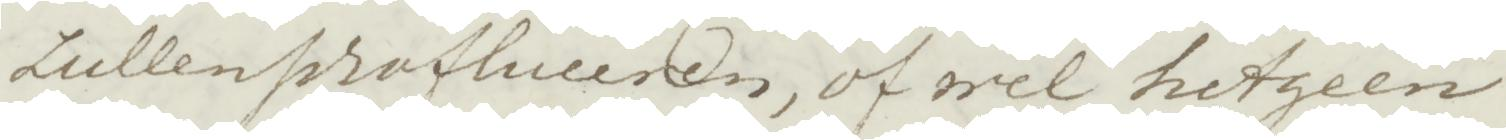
zullen proflueeren, of wel hetgeen
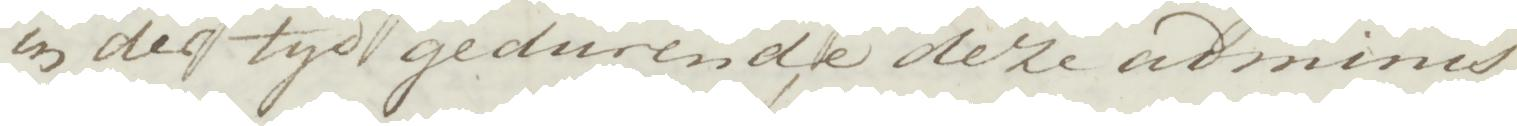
in der tyd gedurende deze adminis=
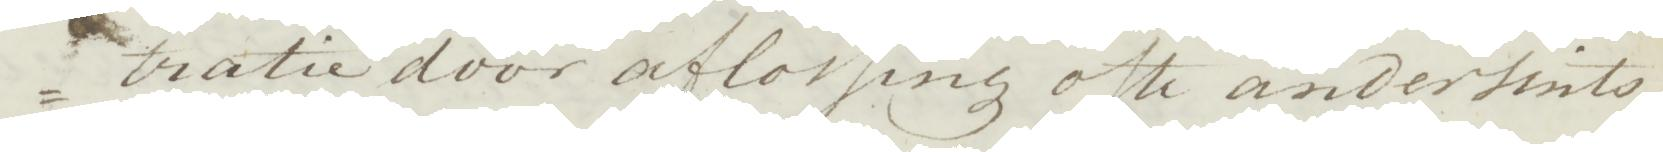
=tratie door aflossing ofte andersints,
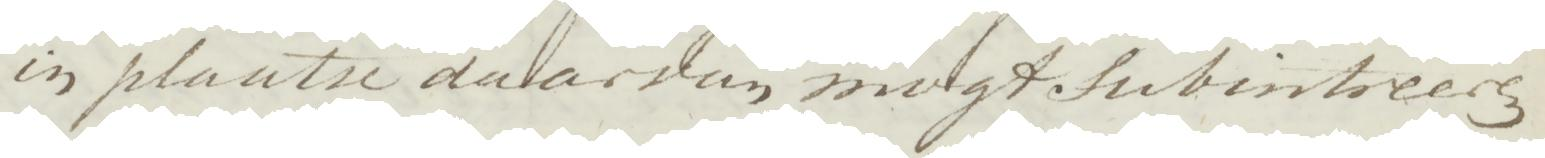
in plaatse daarvan mogt subintreeren
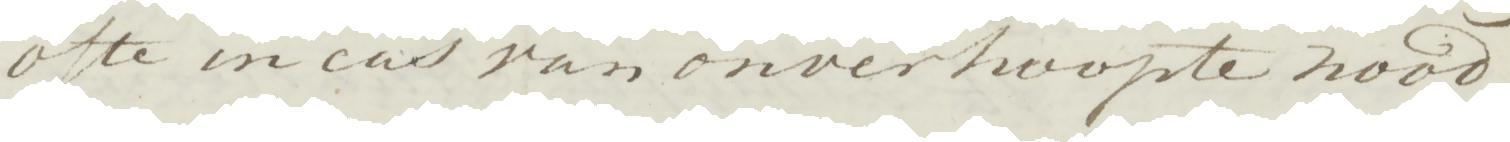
ofte in cas van onverhoopte nood
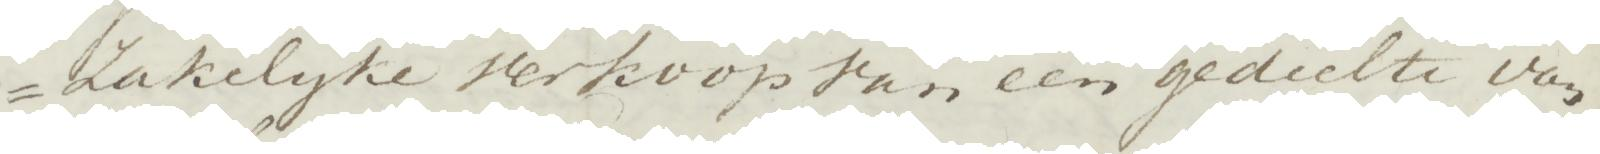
=zakelyke verkoop van een gedeelte van
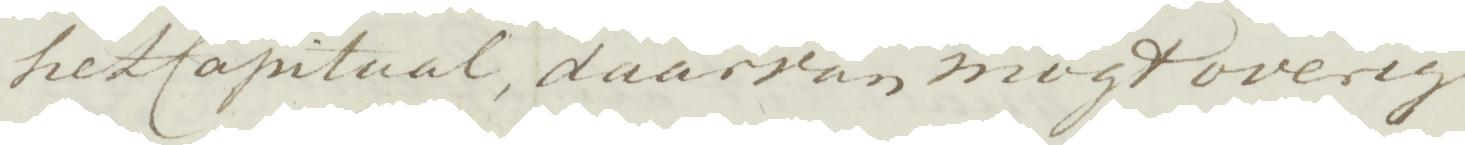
het Capitaal, daarvan mogt overig
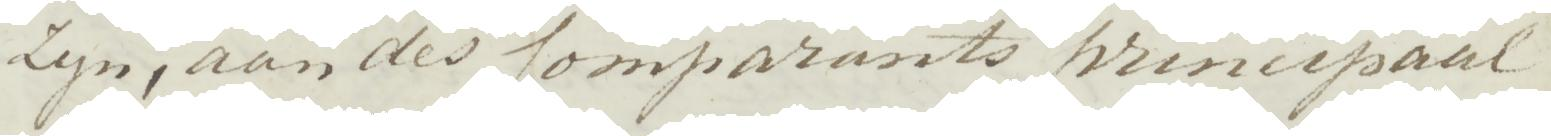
Zyn, aan des Comparants principaal
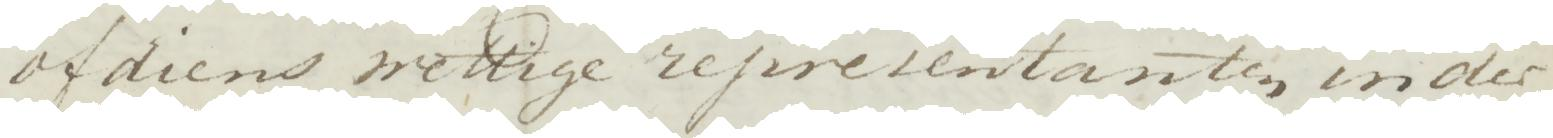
of diens wettige representanten in der
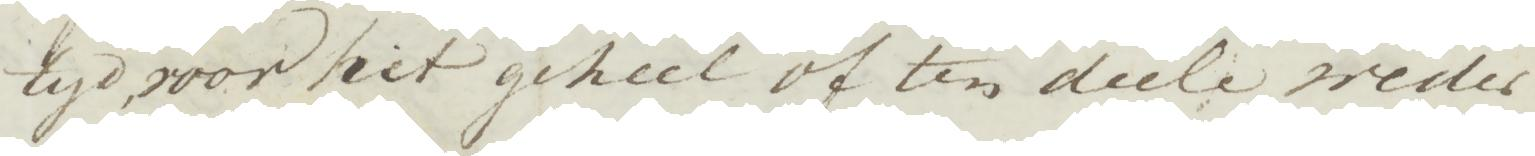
tyd, voor het geheel of ten deele weder
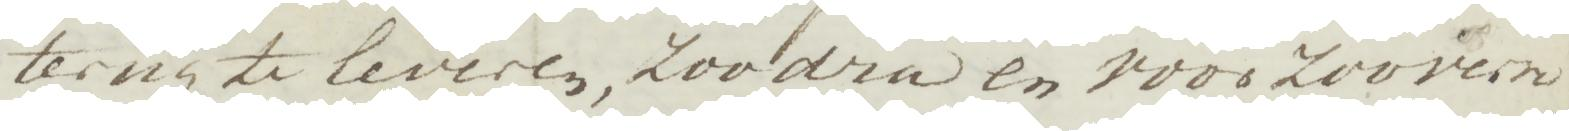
terug te leveren, zoodra en voor zooverre
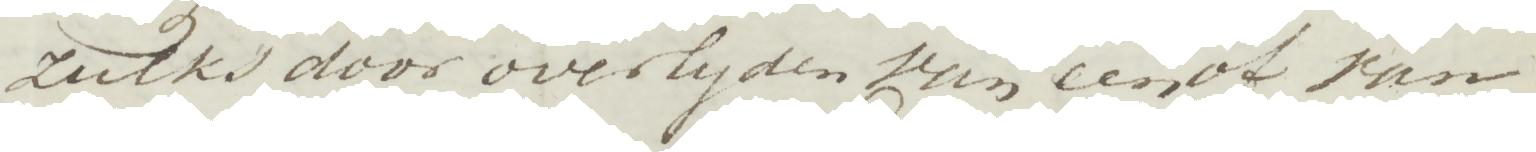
zulks door overlyden van een of van
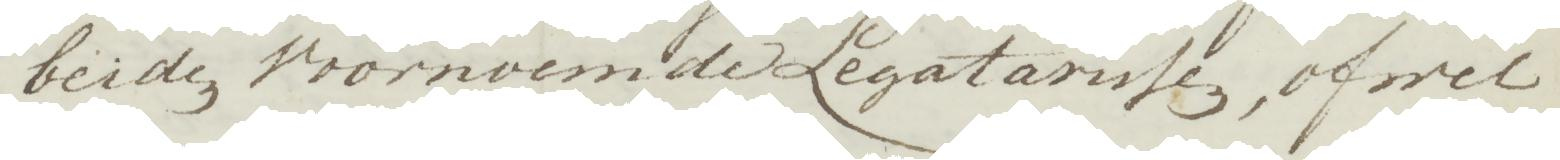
beiden voornoemde Legatarissen, of wel
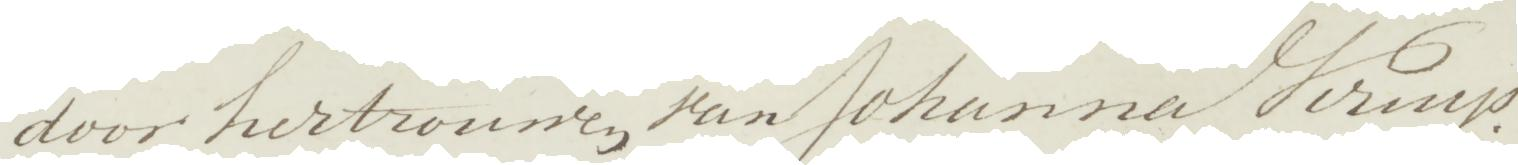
door hertrouwen van Johanna Kruys.
